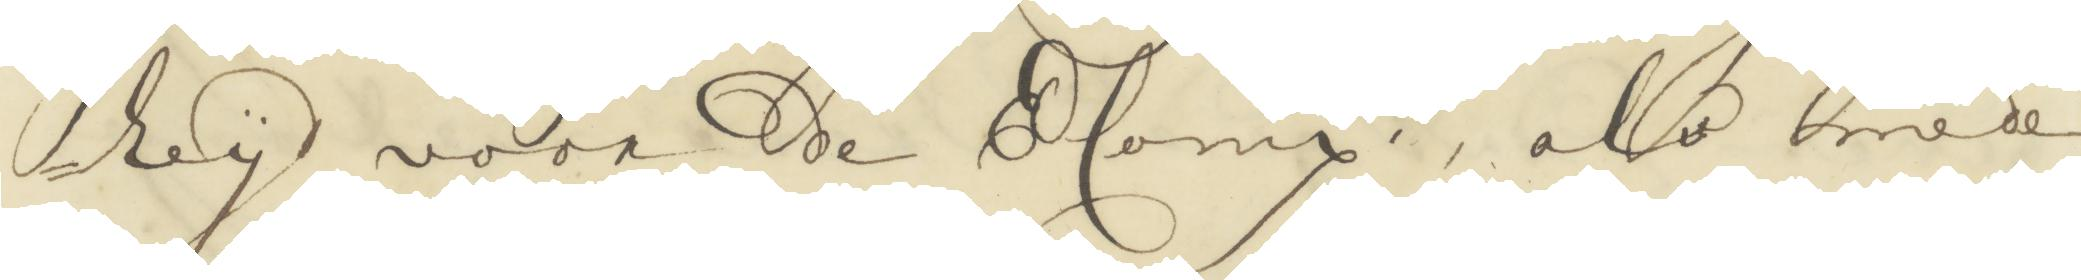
=heijd voor de E Comp„e, als mede
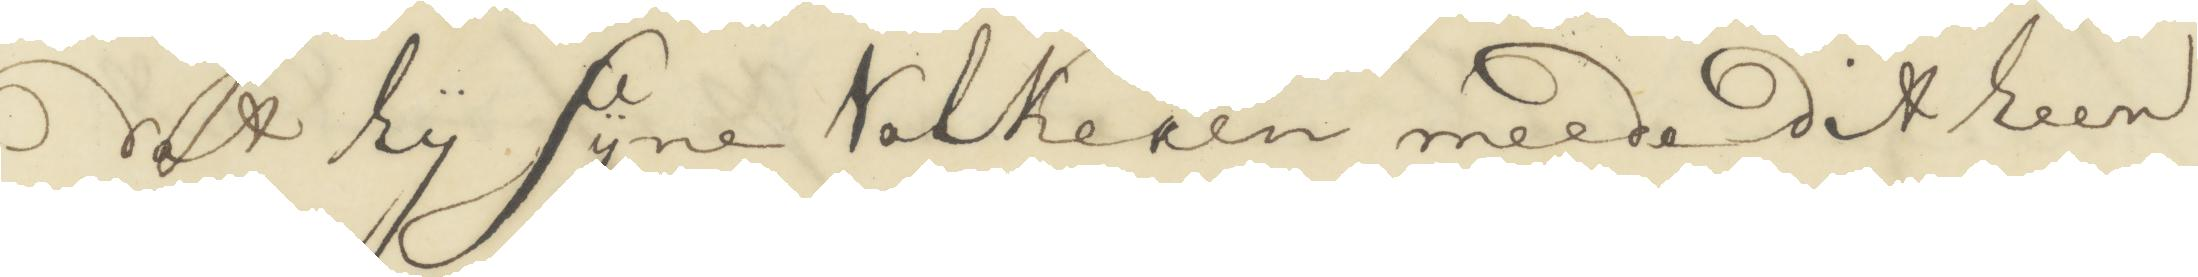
dat hij sijne volkeren meede dit heen
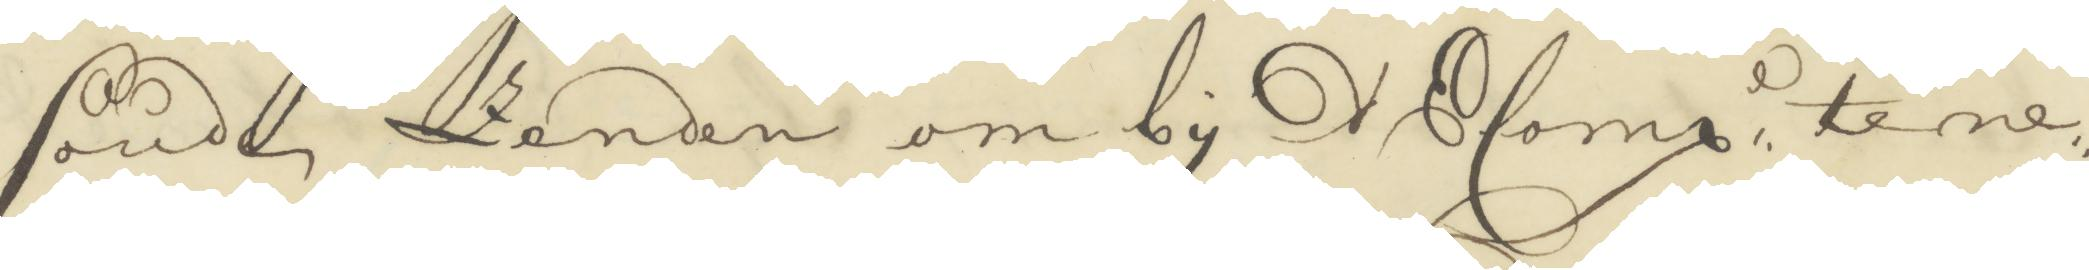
soude zenden om bij d’ E Comp„e te ne„
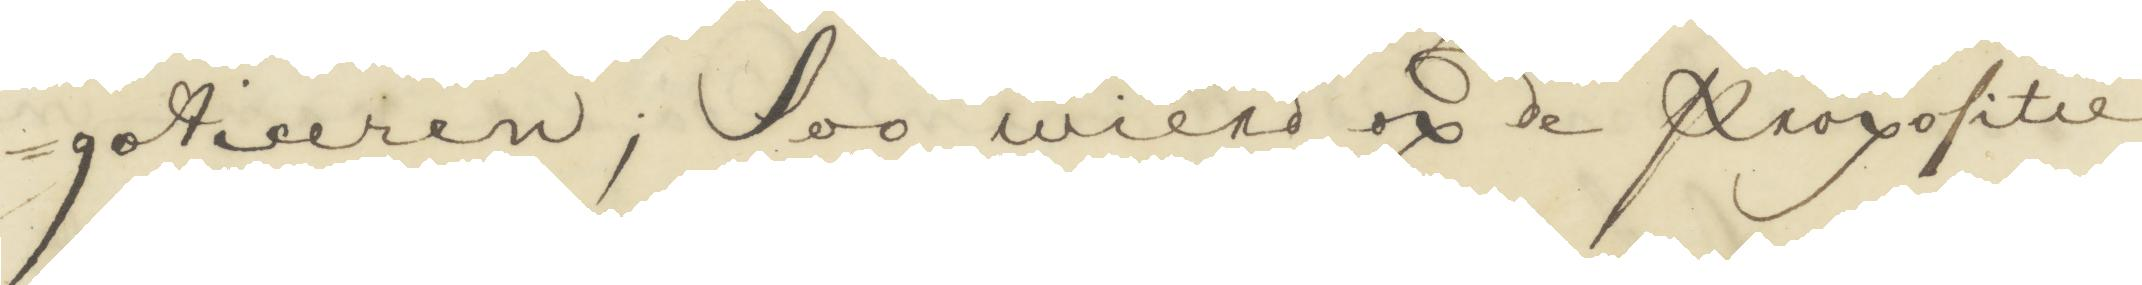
=gotieeren; soo wierd op de propositie
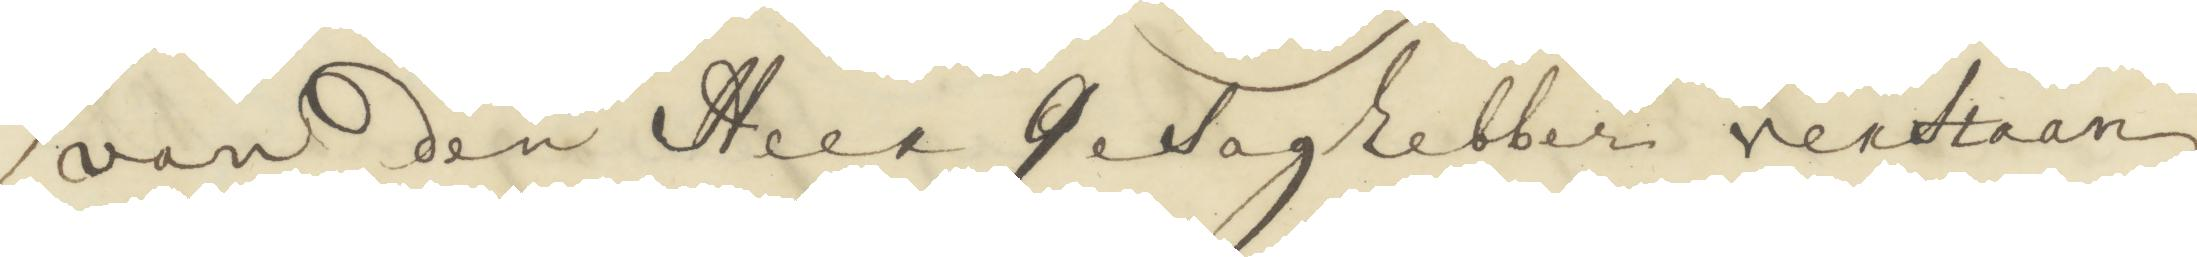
van den Heer gesaghebber verstaan
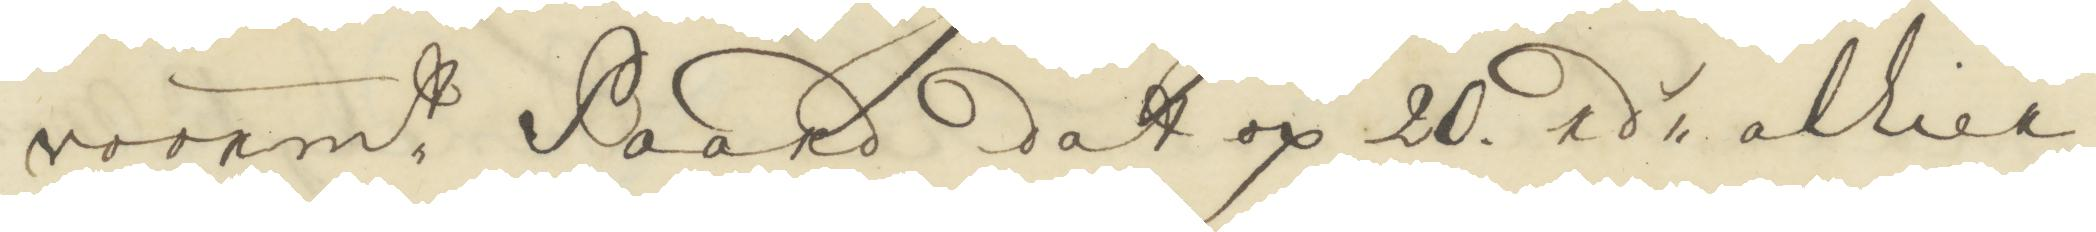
voorm„t Paard dat op 20. rd„s alhier
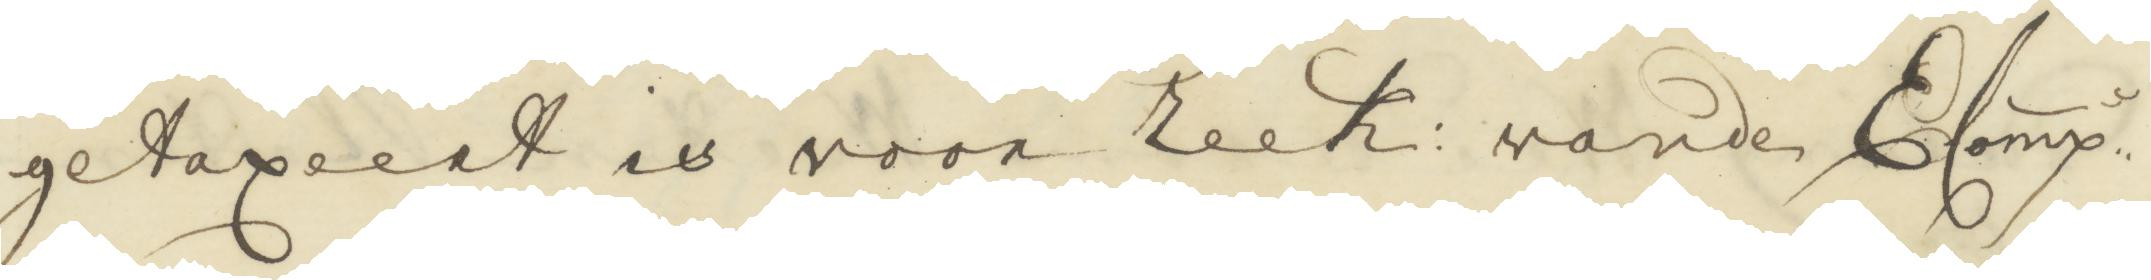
getaxeert is voor reek: vande EComp„e
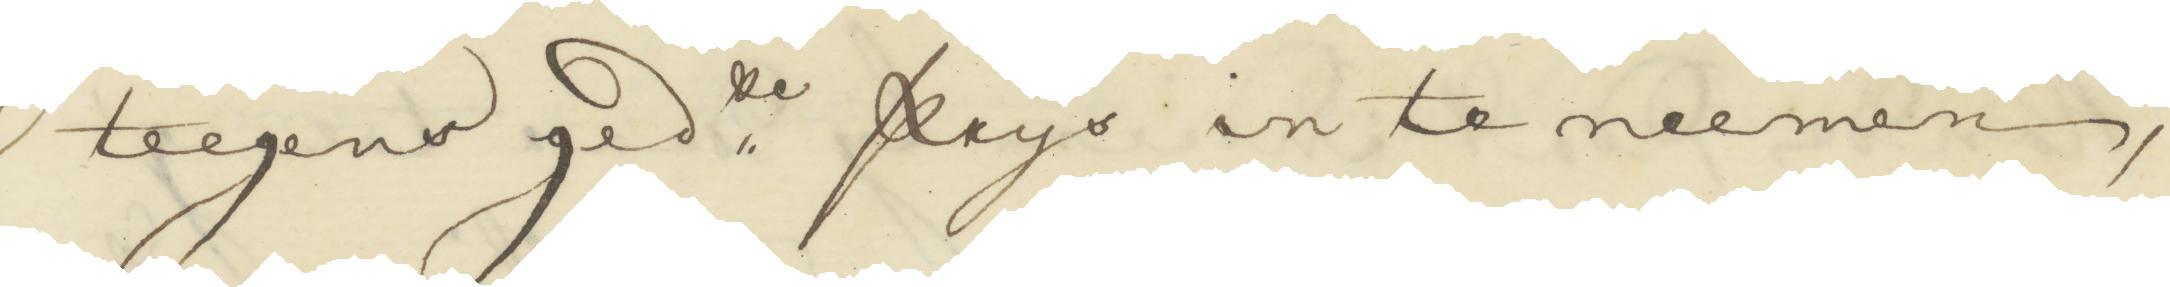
teegens ged„te prijs in te neemen,
